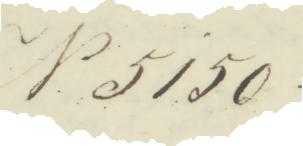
N. 5150.
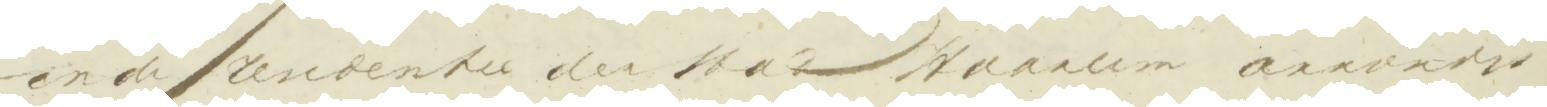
in de residentie der stad Haarlem arrondis
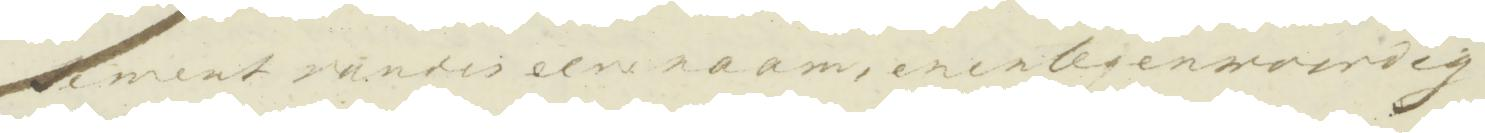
sement van deselve naam, en integenwoordig
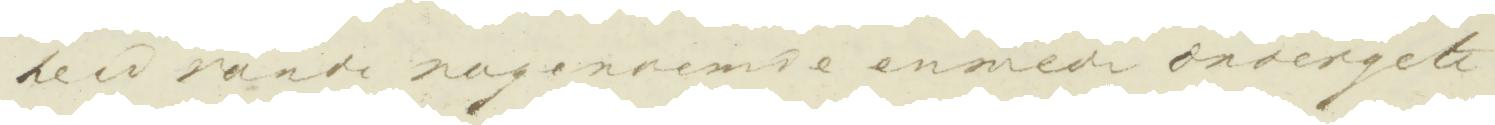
heid vande nagenoemde en mede ondergete
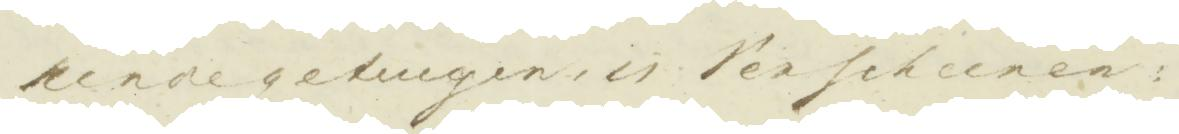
kende getuigen, is Verscheenen:
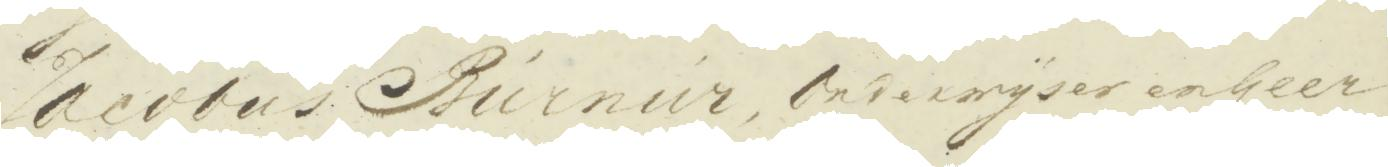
Jacobus Burnur, Onderwijser en Geer
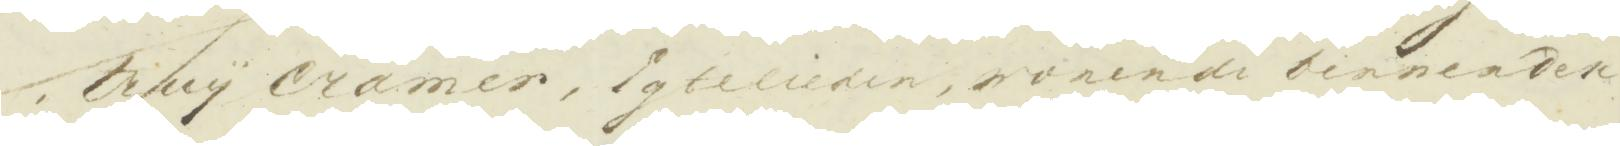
, truij Cramer, Egtelieden, wonende binnen den
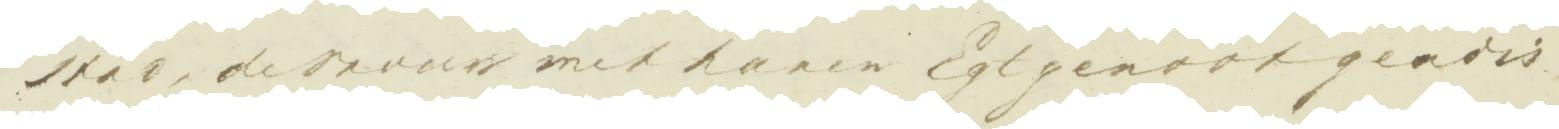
stad, de vrouw met haren Egtgenoot geadis
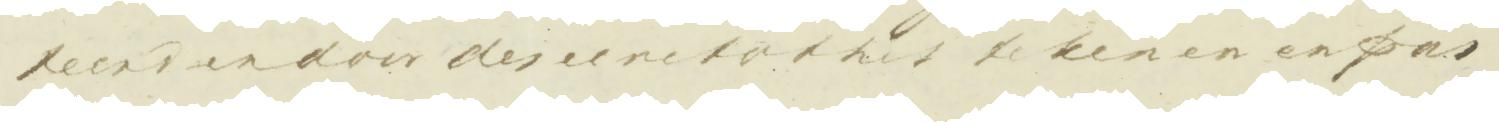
teerd en door dezelve tot het tekenen en pas
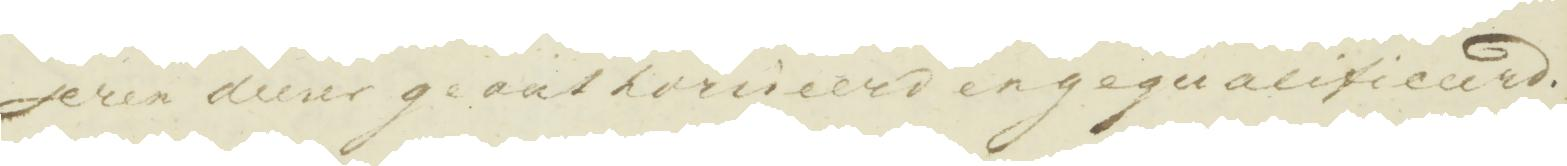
seren deeser geauthoriseerd en gequalificeerd.
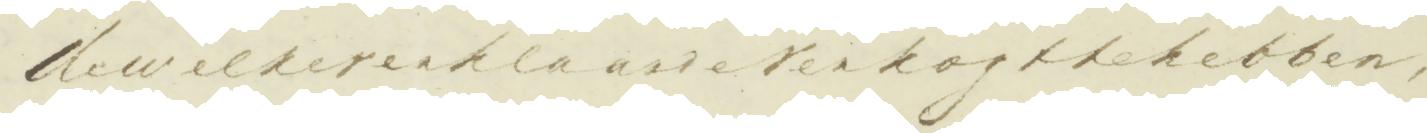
dewelke verklaarde verkogt te hebben,
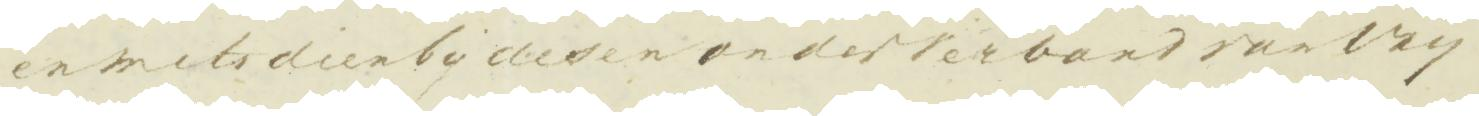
en mitsdien by desen onder verband van Vry
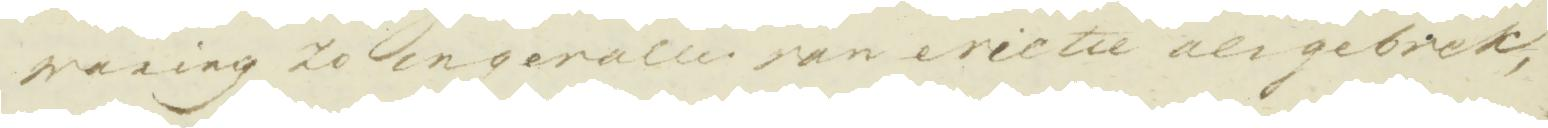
waring zo ingevalle van evictie als gebrek,
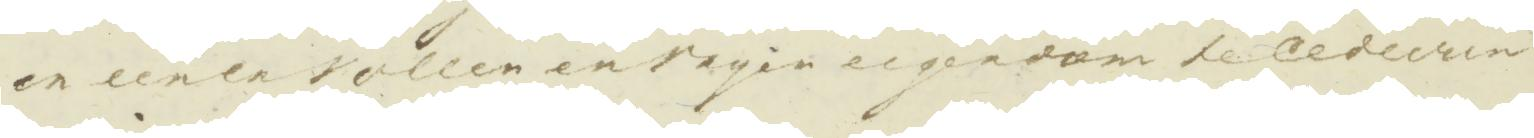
en een en vollen en vrijen eigendom te cedeeren
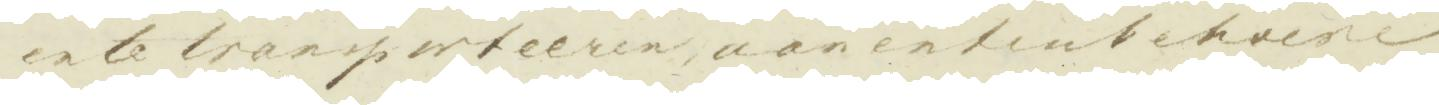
en te transporteeren, aan en ten behoeve
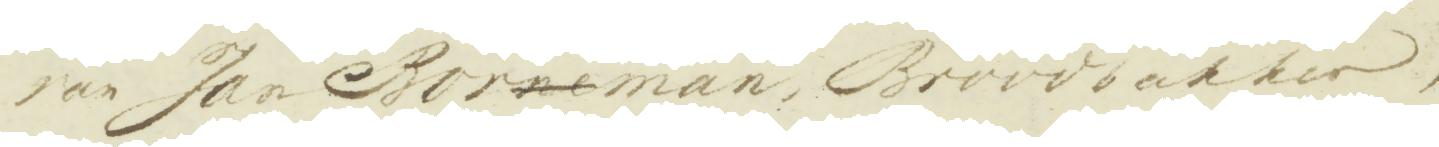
van Jan Borneman, Broodbakker,
